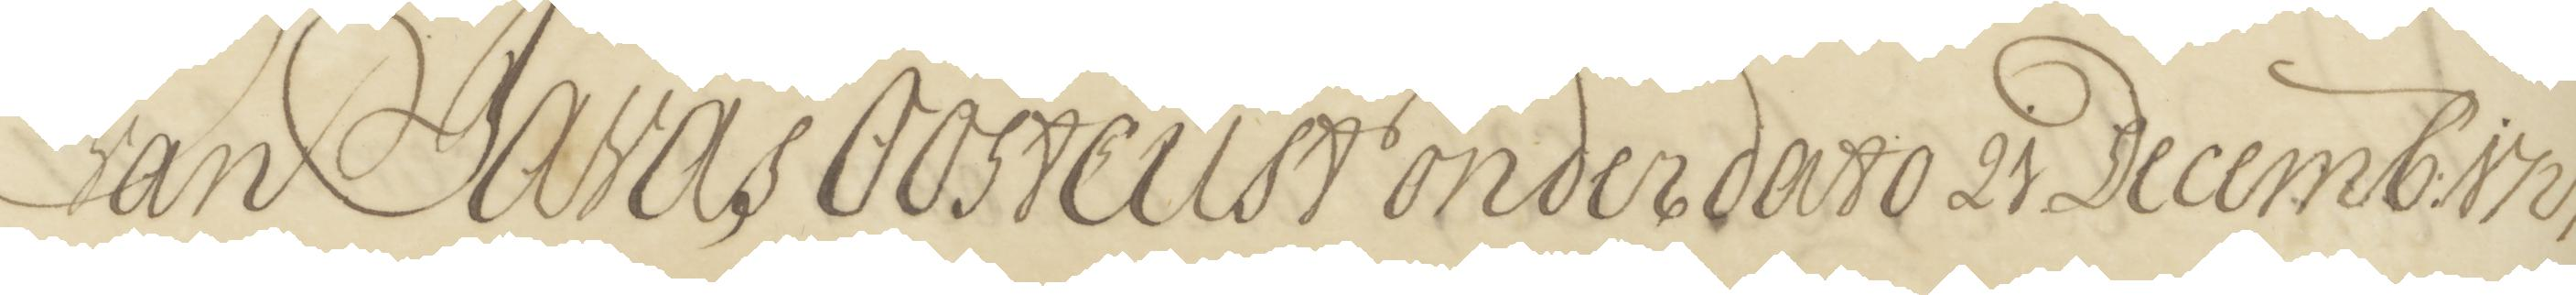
Van Javâs Oostcust onder dato 21 Decemb: 1727
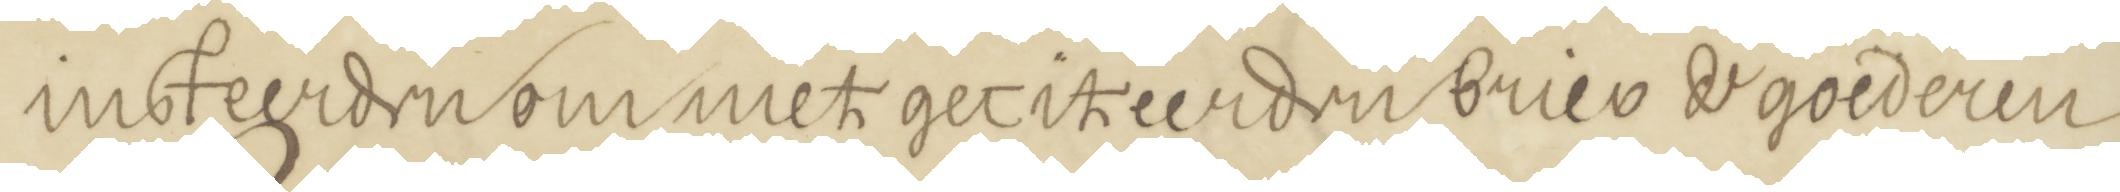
insteerden om met geciteerden briev de goederen
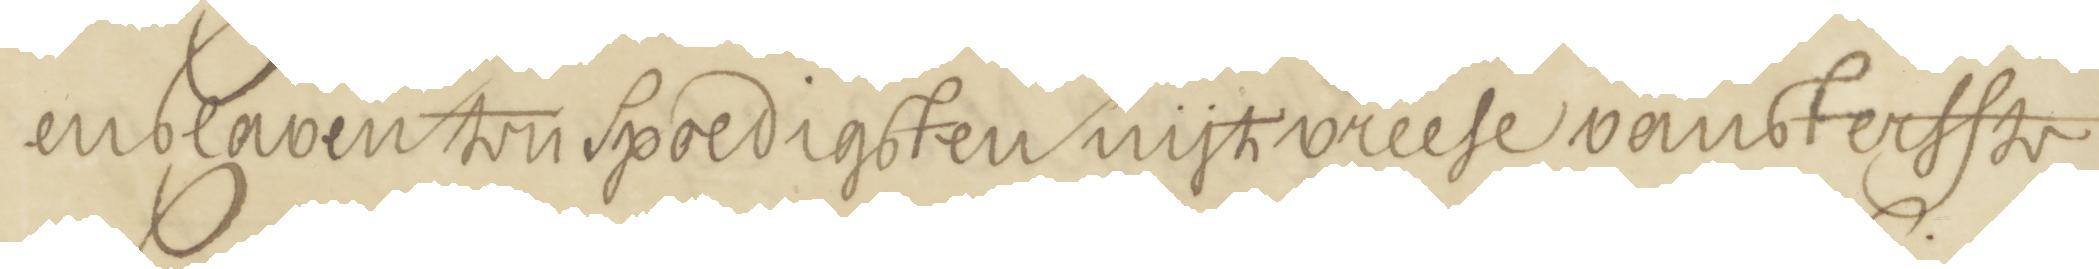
en slaven ten spoedigsten uijt vreese van sterffte
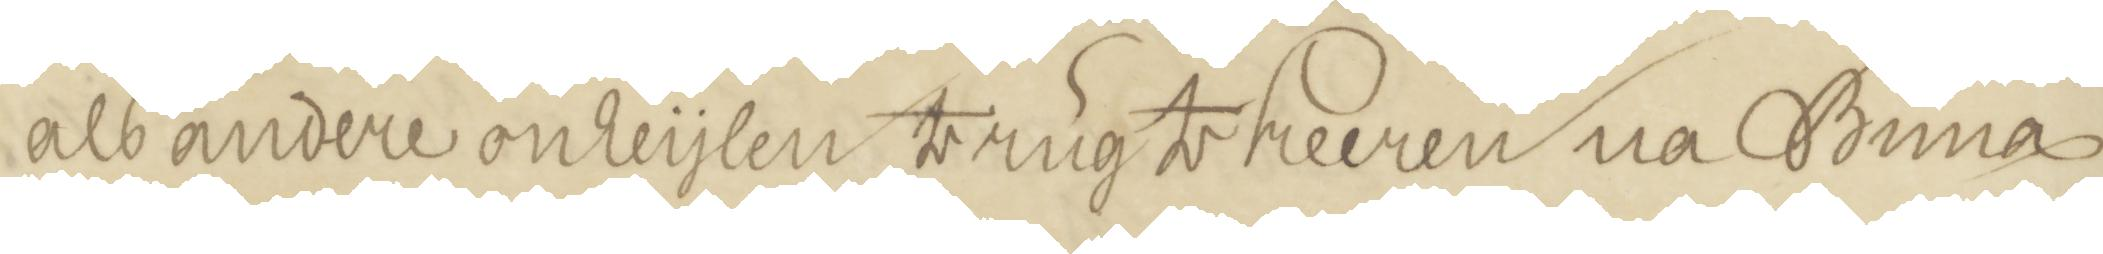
als andere onheijlen te rug te keeren na Bima
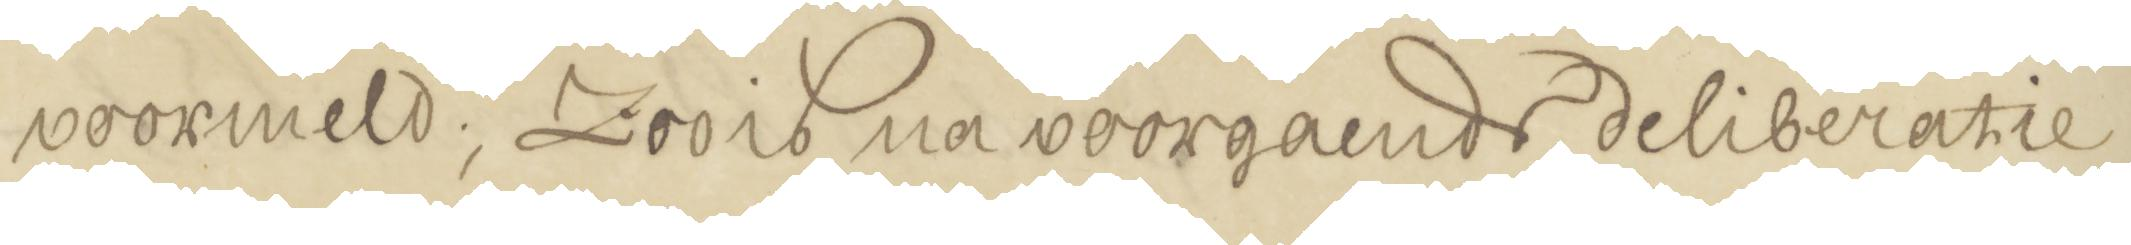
voormeld; zoo is na voorgaends deliberatie
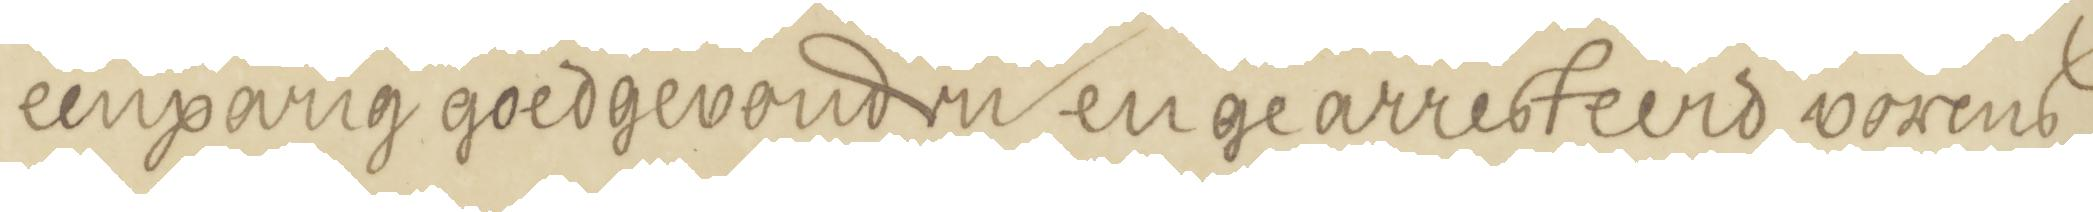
eenparig goedgevonden en gearresteerd vorens
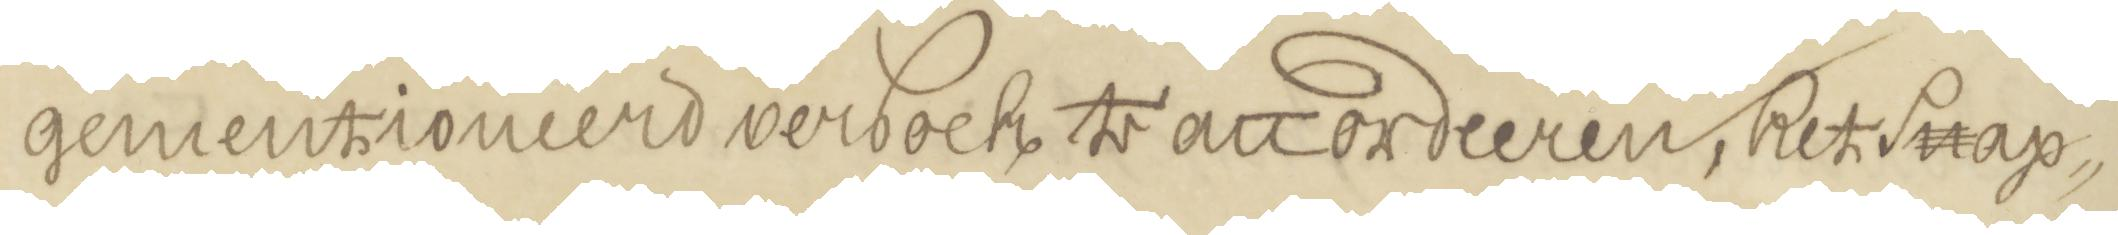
gementioneerd versoek te accordeeren, het snap„
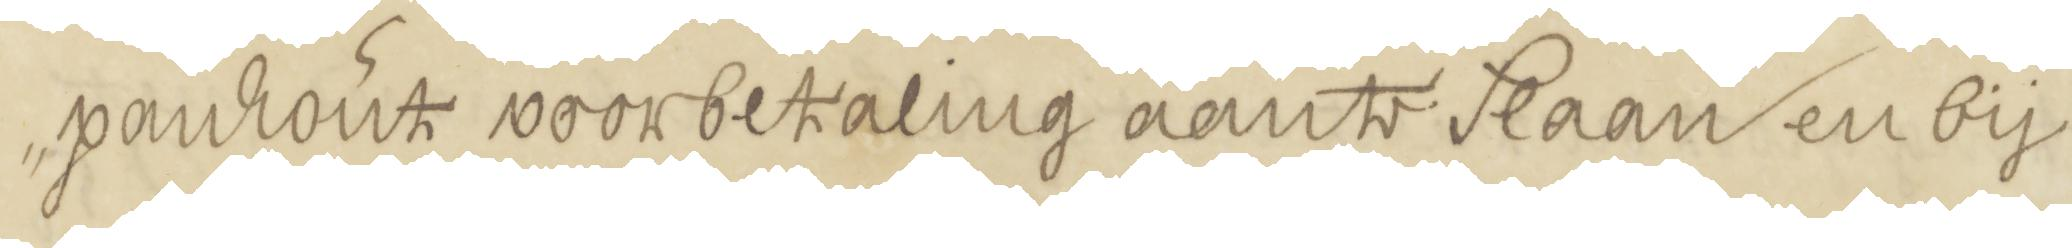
„panhout voorbetaling aante slaan en bij
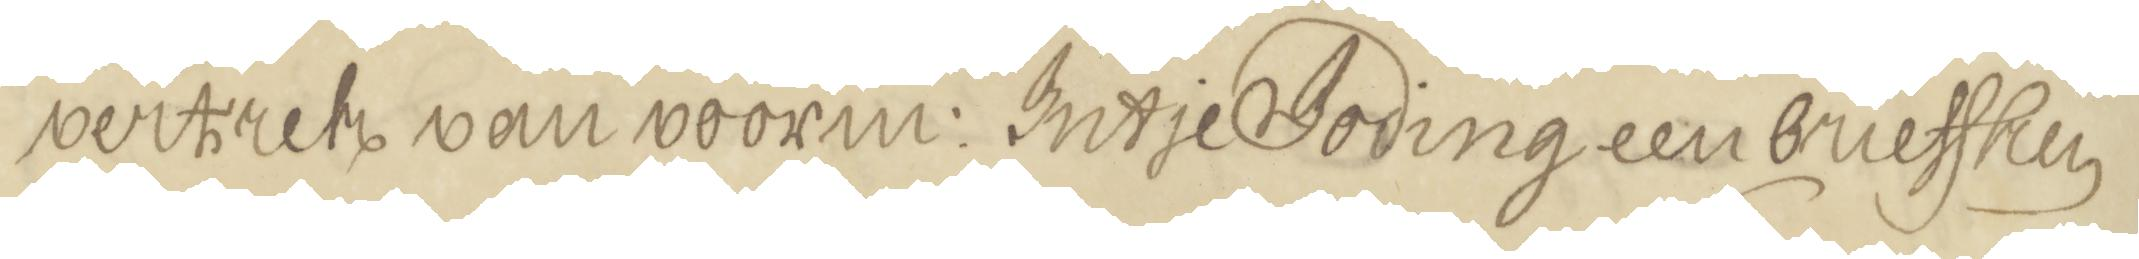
vertrek van voorm: Jntje Joding een brieffken
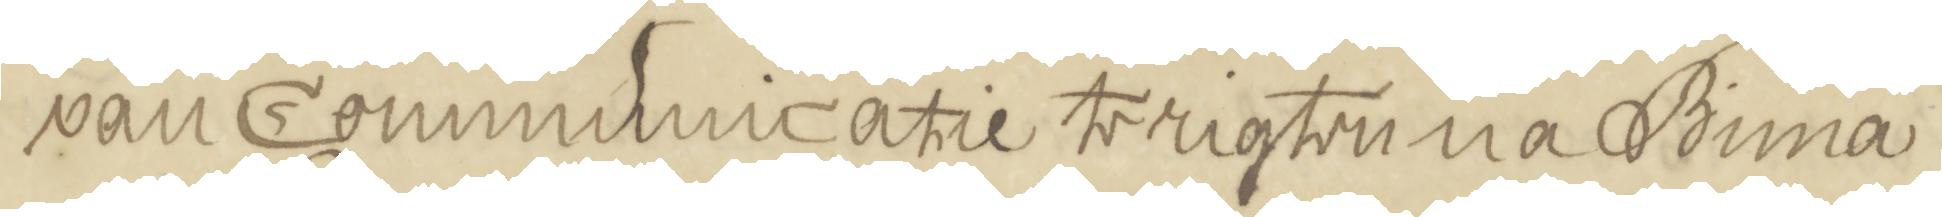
van communicatie te rigten na Bima
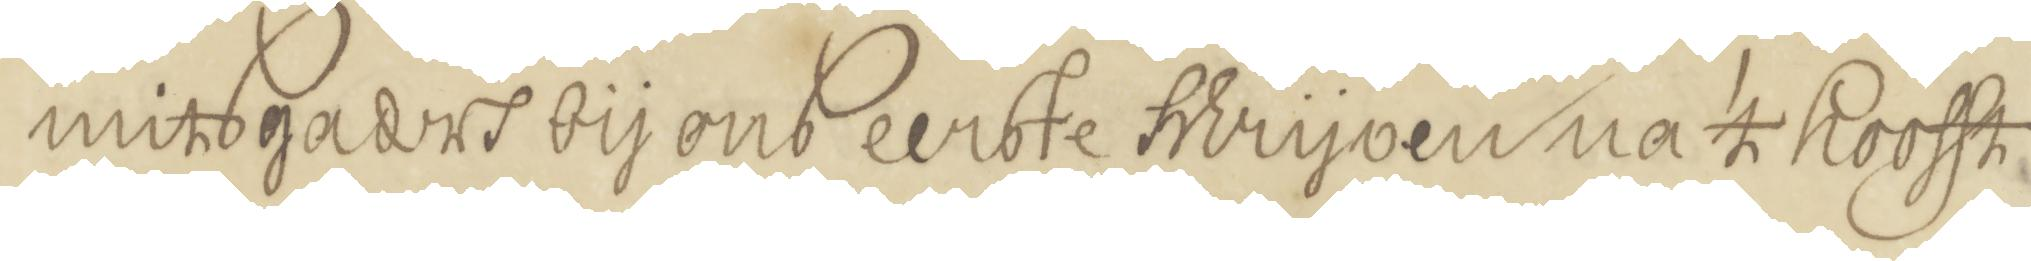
mitsgaders bij ons eerste schrijven na ’t hoofft
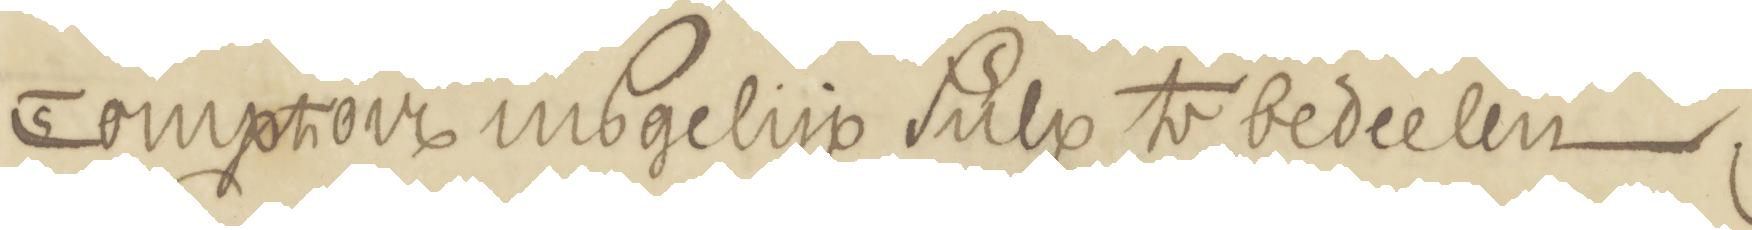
comptoir insgelijx sulx te bedeelen.
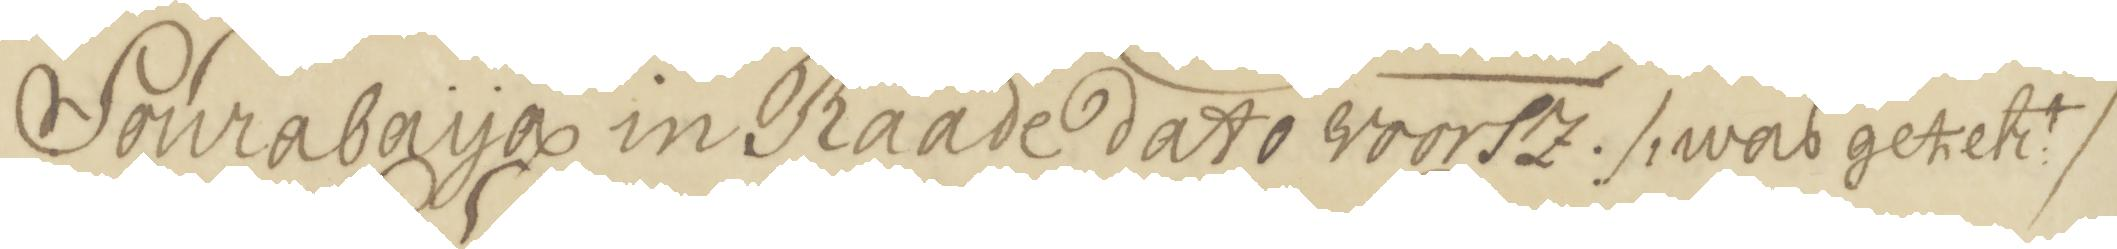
Sourabaija in Raade dato voorsz: /:was getek:t/
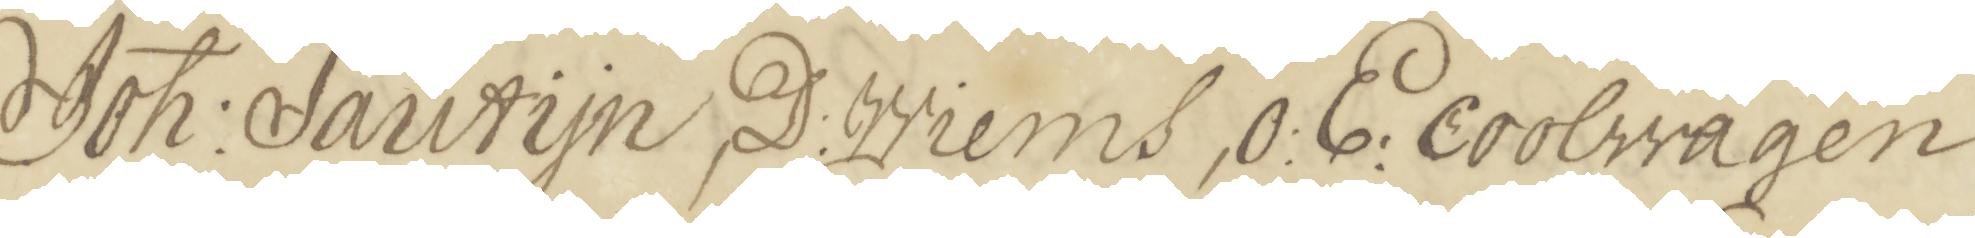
Joh: Sautijn, D: Wiems, o: E: coolwagen
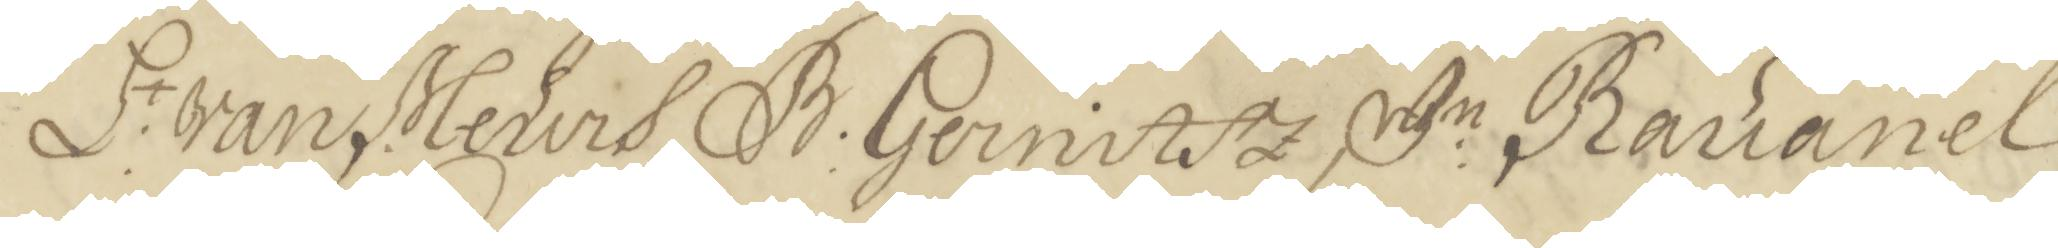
L:t van Meurs, B: Gernitsz, J:n Rauanel
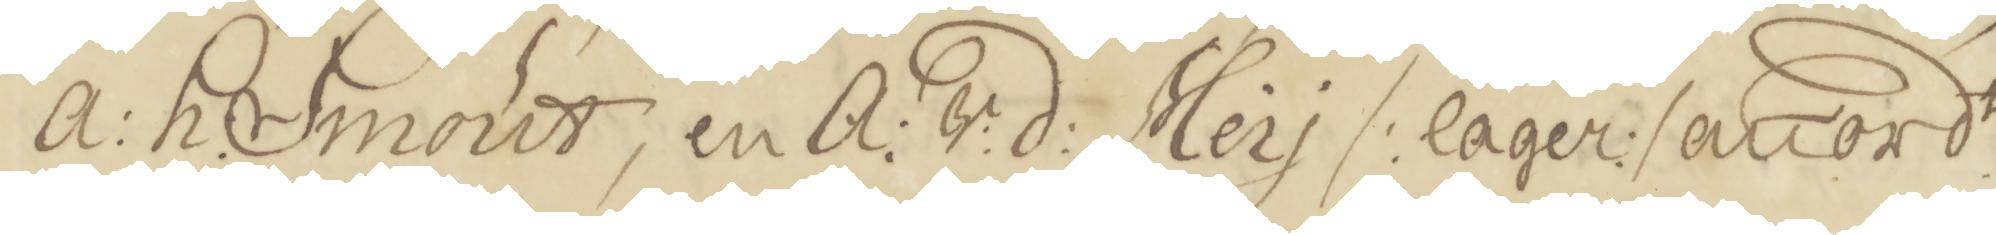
a: h: Smout, en A: v: d: Meij /: lager:/ accord:t,
